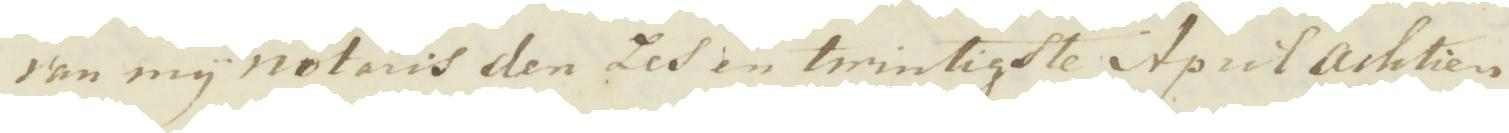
van mij notaris den zes en twintigste April achtien
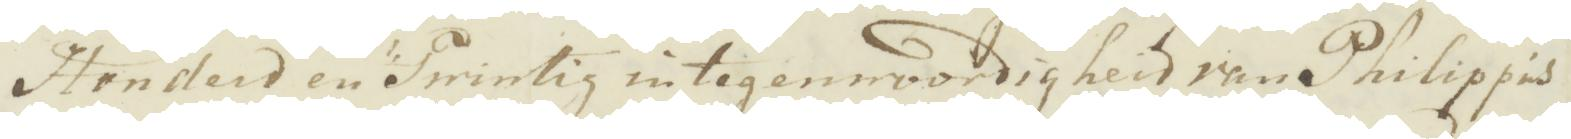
Honderd en Twintig in tegenwoordigheid van Philippus
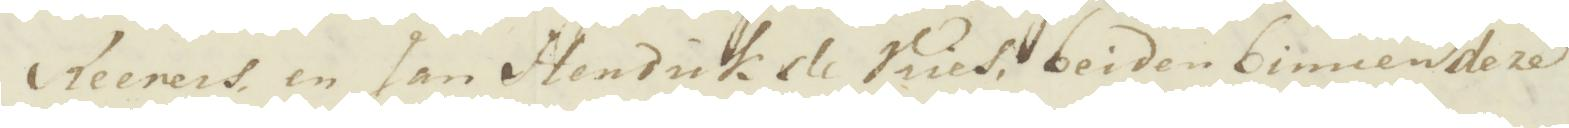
Reevers en Jan Hendrik de Vries, beiden binnen deze
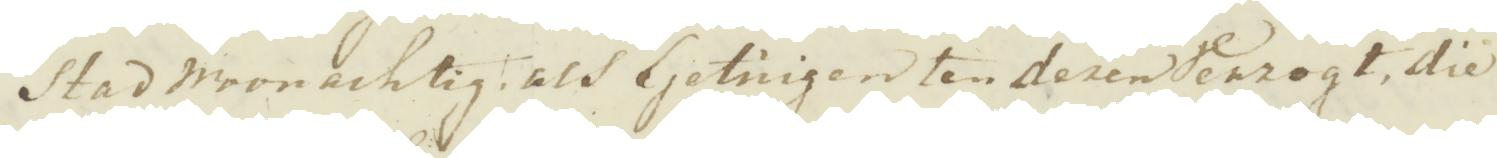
stad woonachtig, als Getuigen ten dezen Verzogt, die
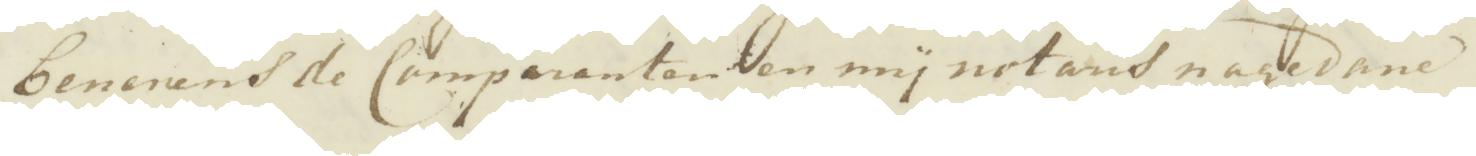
benevens de comparanten en mij notaris nagedane
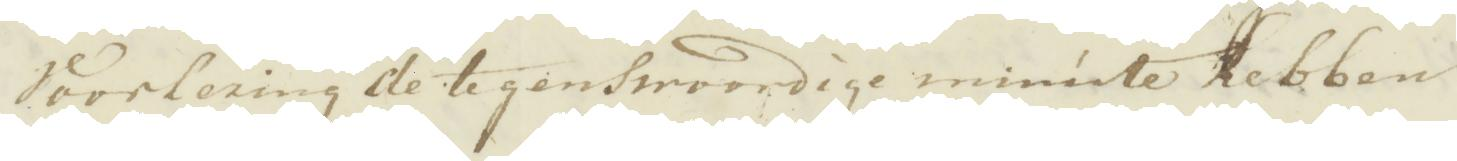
Voorlezing de tegenswoordige minute hebben
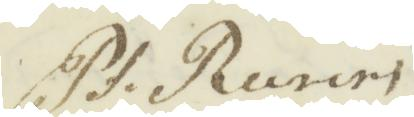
P„s Reevers
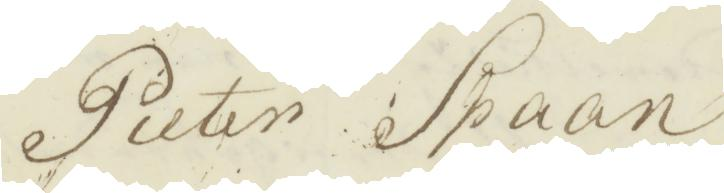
Pieter Spaan
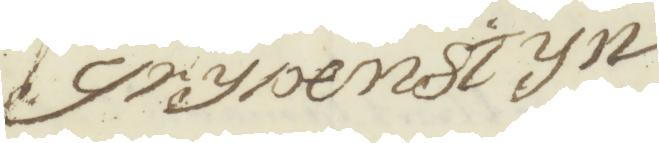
grypenstyn
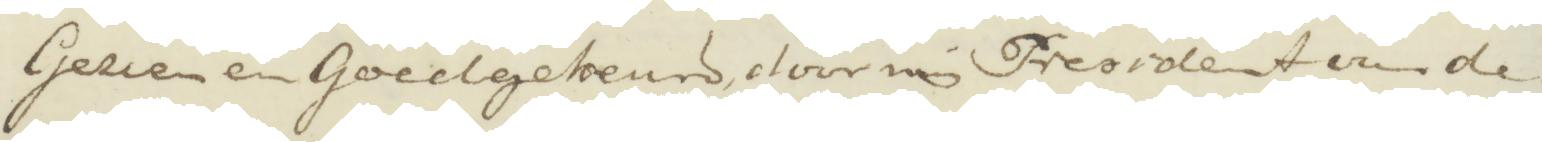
Gezien en Goedgekeurd, door mij President van de
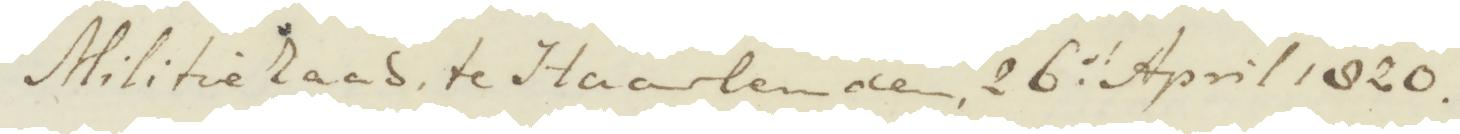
Militie raad, te Haarlem den, 26:' April 1820.
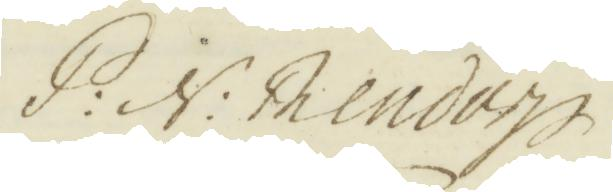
P: V: Rendorp
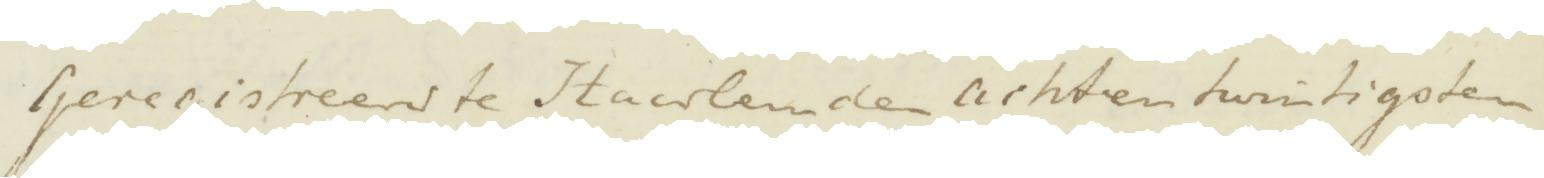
Geregistreerd te Haarlem den achtentwintigsten
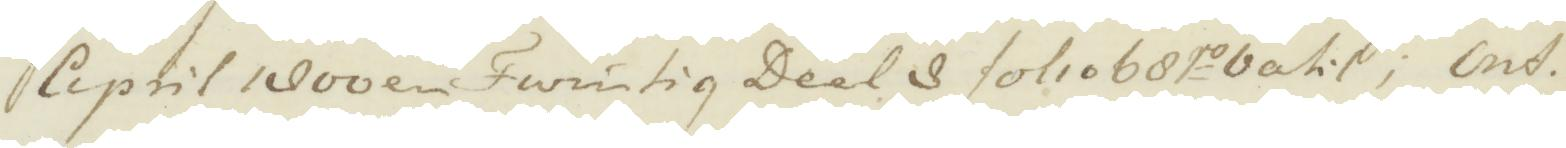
April 1800 en Twintig Deel 8 folio 68 r=o vak 1; ont.
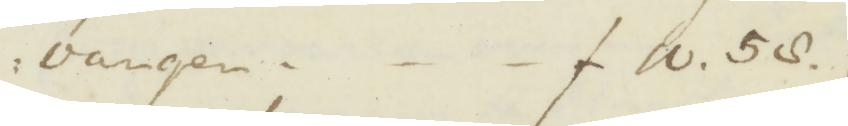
:vangen ƒ 10. 58.
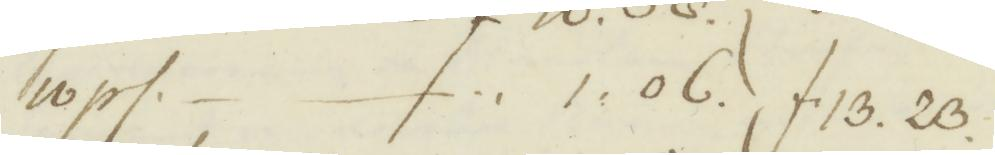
10/c=t „1: 06. ƒ13. 23.
